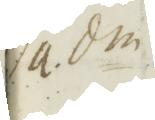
3/4 d=m
